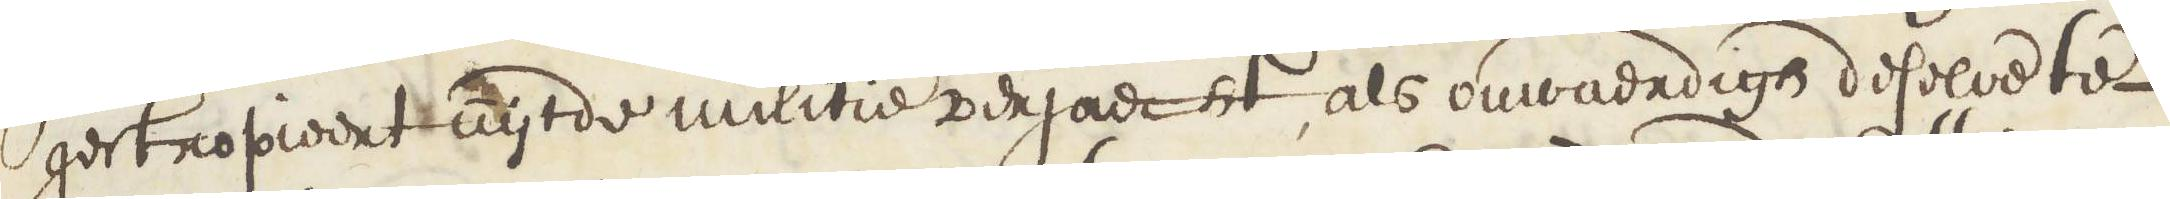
gestropieert uijtde militie verjaecht, als onwaerdigen deselve te-
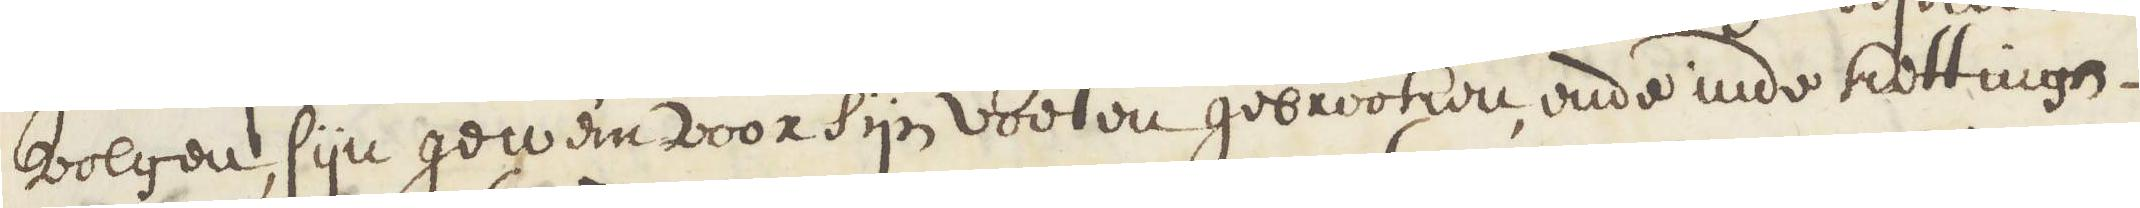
volgen, sijn geweir voor sijn voeten gebrooken, ende inde kettingh
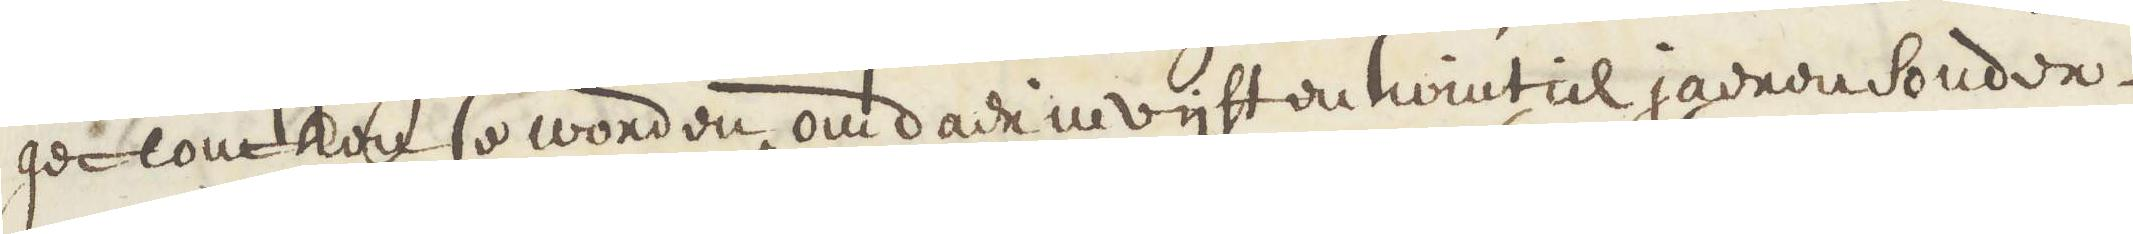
gecloncken te worden, om daer in vijff en twintich jaeren sonder
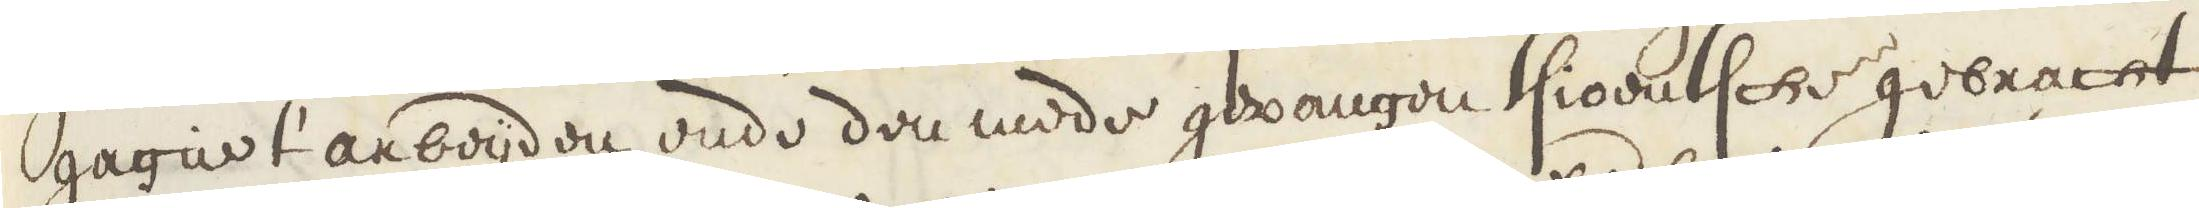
gagie t' arbeijden ende den mede gevangen tsioutsche gebracht
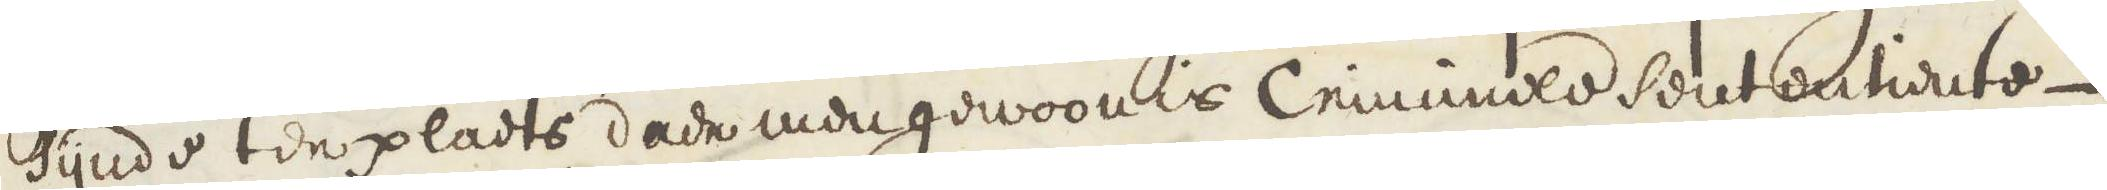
sijnde ter plaets daer men gewoon is Criminele sententien te —
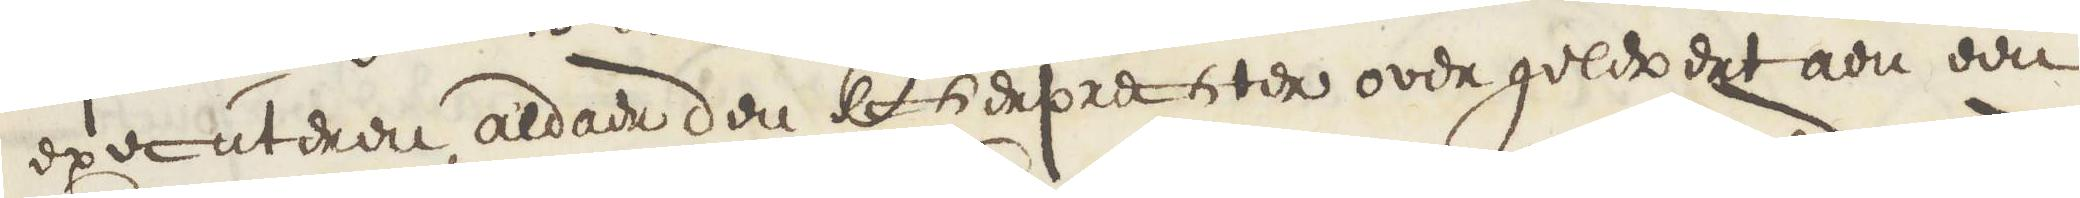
executeren, aldaer den scherprechter over gelevert aen een
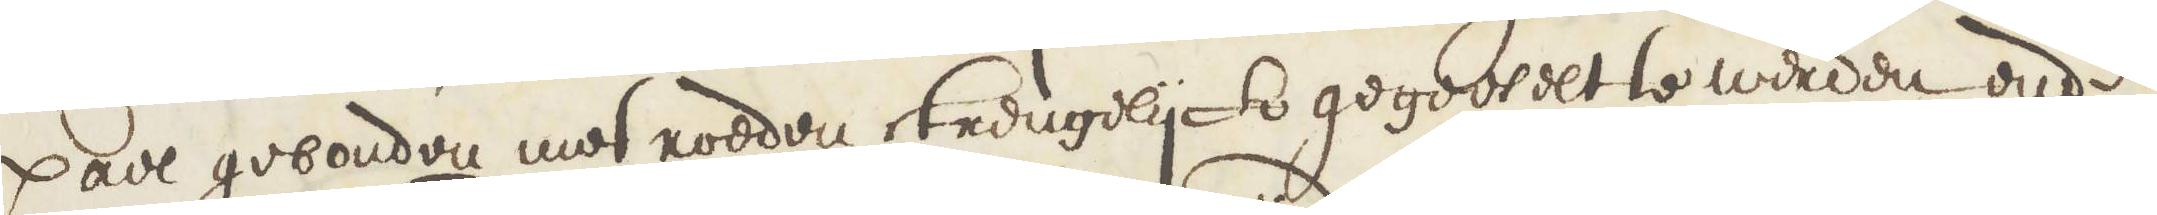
pael gebonden met roeden strengelijck gegeeselt te werden ende
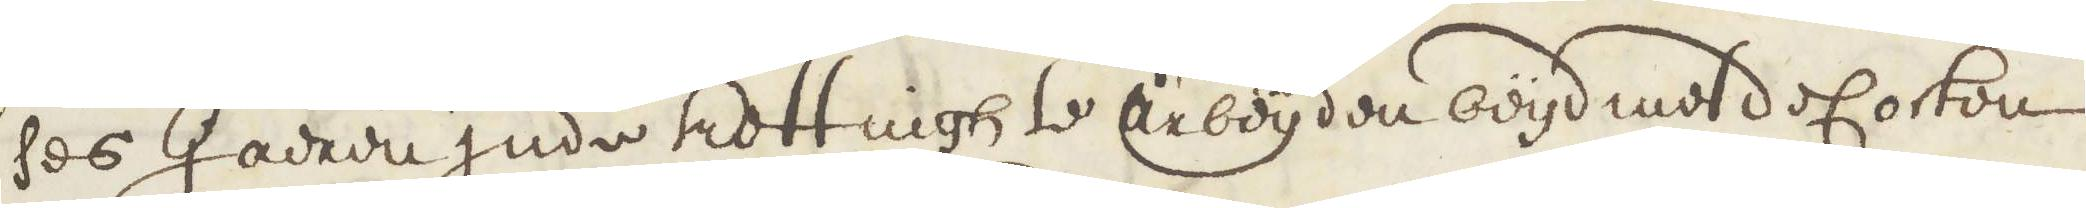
ses jaeren jnde kettingh te arbeijden beijd met de Costen
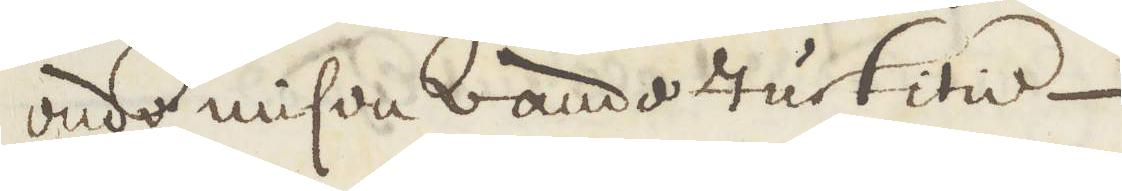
ende misen vande Iustitie
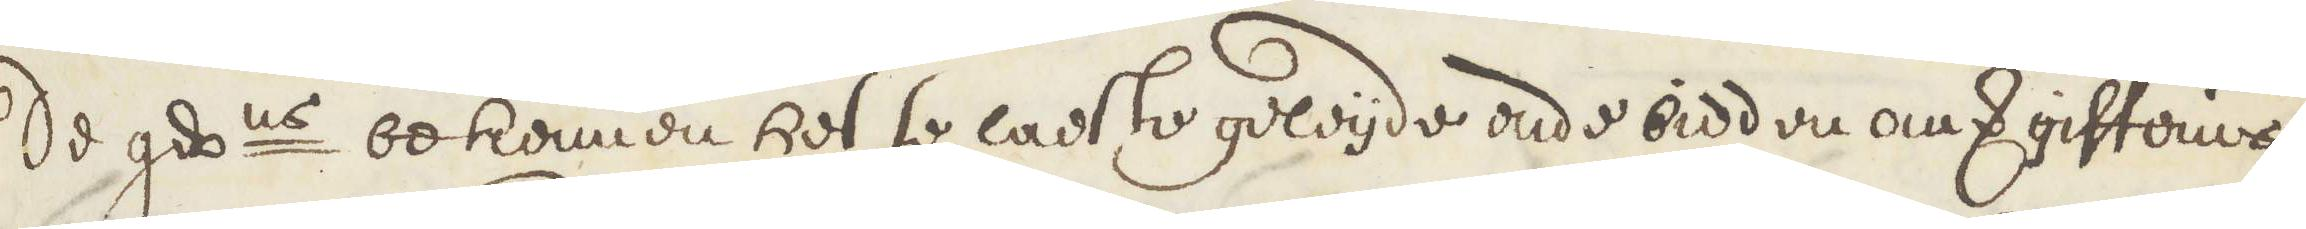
de gev=ns bekennen het te laeste geleijde ende bieden om vergiffenis
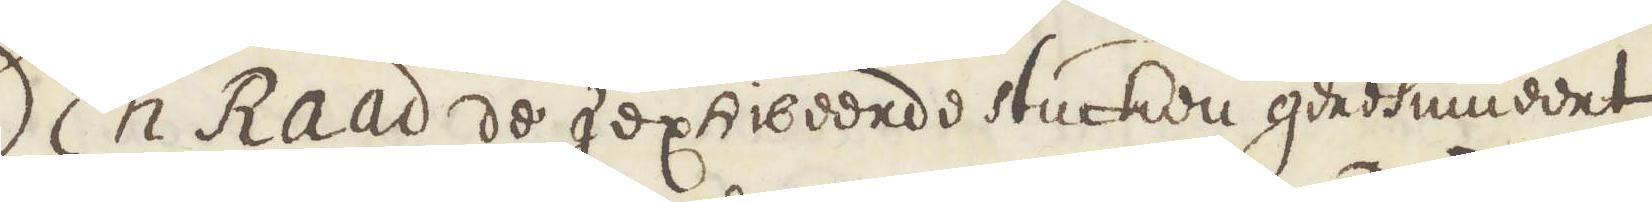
Den Raad de gexhibeerde stucken geresumeert
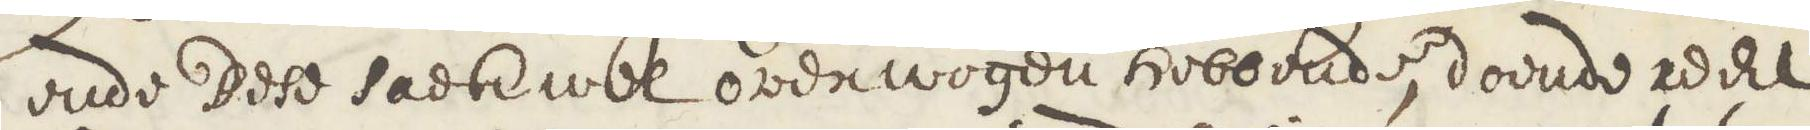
ende Dese saek wel overwogen hebbende, doende recht
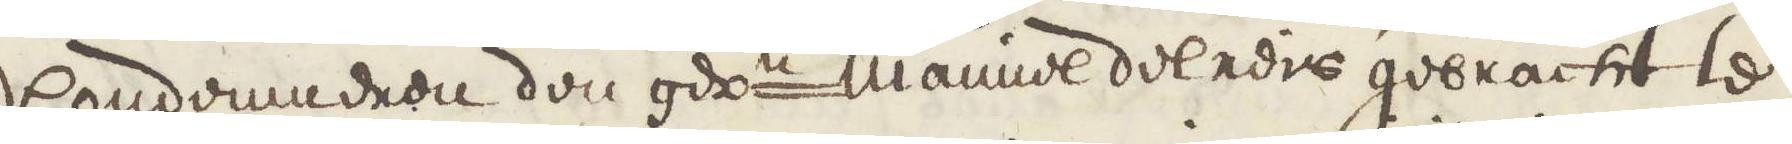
Condenneeren den gev=n Manuel del reis gebracht te
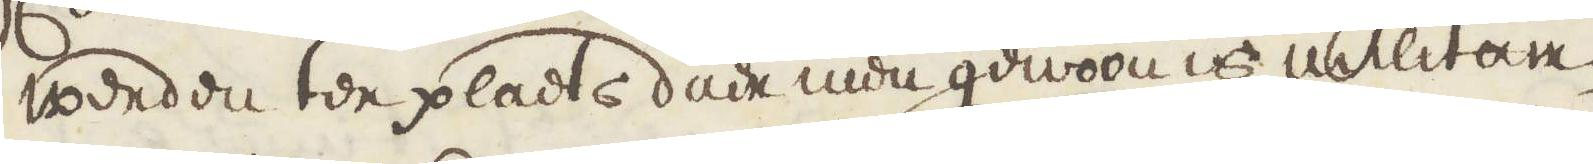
werden ter plaets daer men gewoon is miilitair
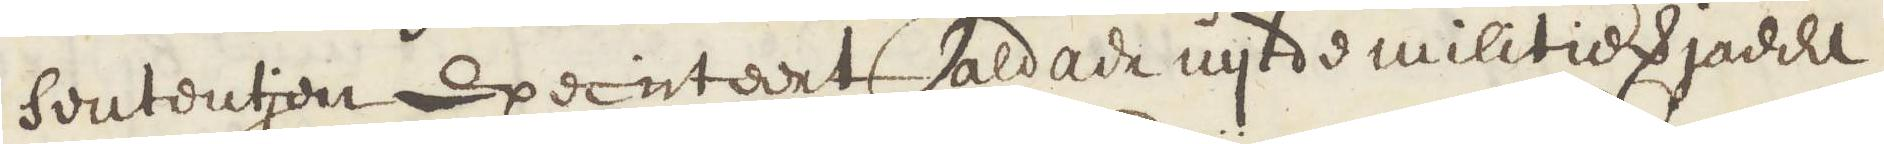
sententien Executeert aldaer uijtde militie verjaecht
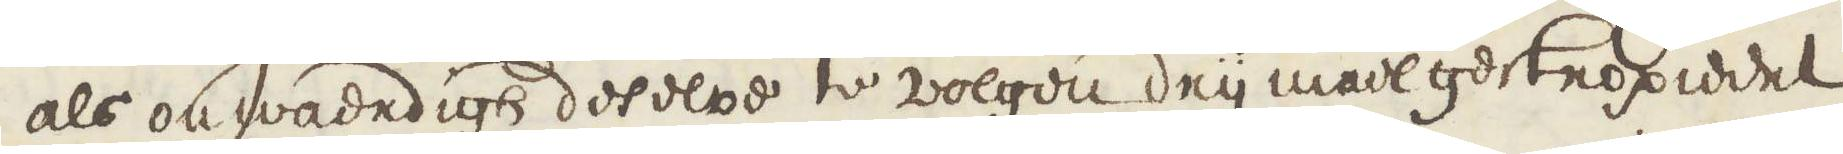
als onwaerdigh deselve te volgen drij mael gestropieert
